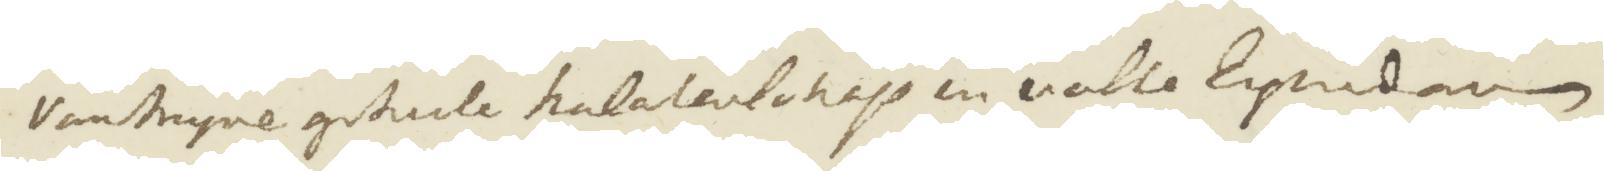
van myne geheel nalatenschap in volle Eigendom
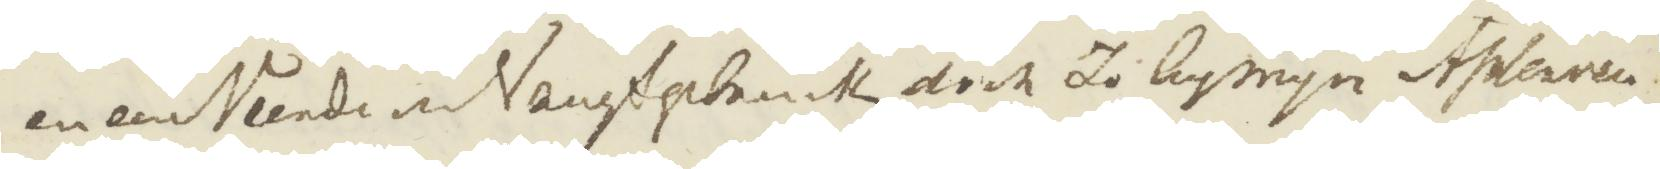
en een Vierde in Vruchtgebruik, doch zo by myn Afsterven
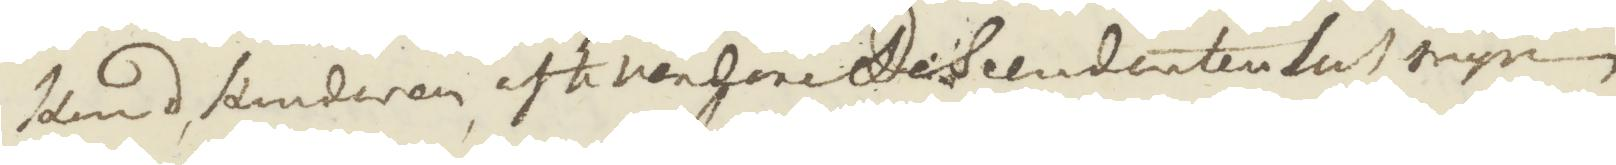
kind, kinderen, ofte verdere Descendenten uit myn
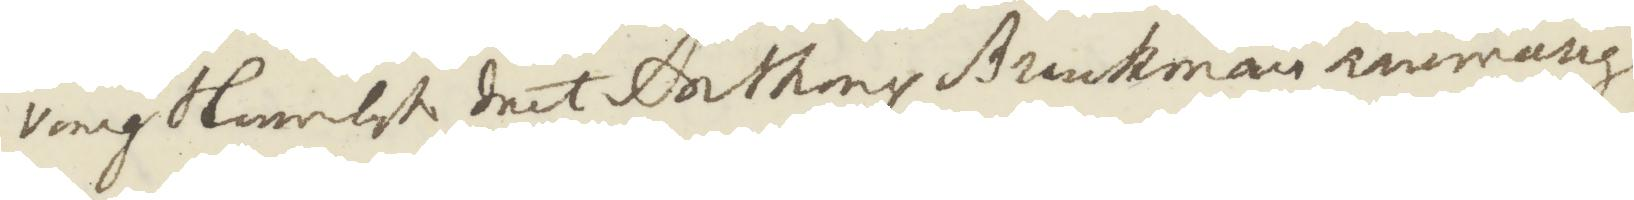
vorig Huwelijk met Anthony Brinkman aanwezig
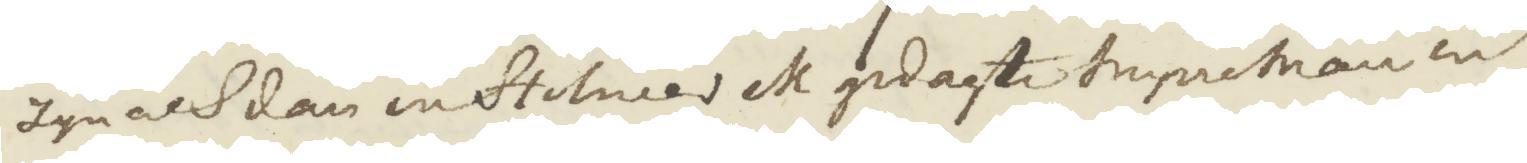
zyn als dan institueer ik gedagte myne man in
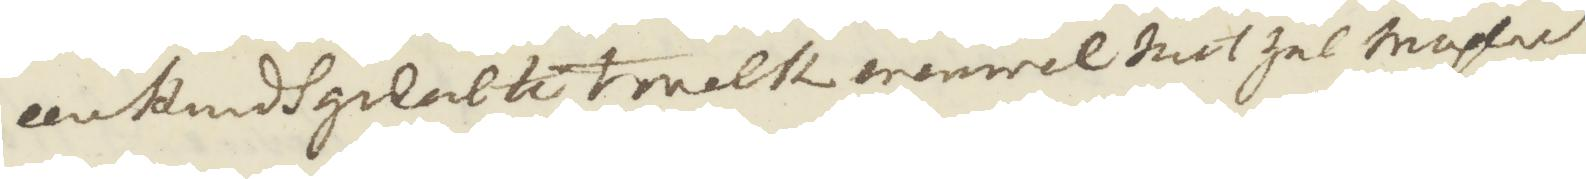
een kindsgedeelte, twelk evenwel niet zal mogen
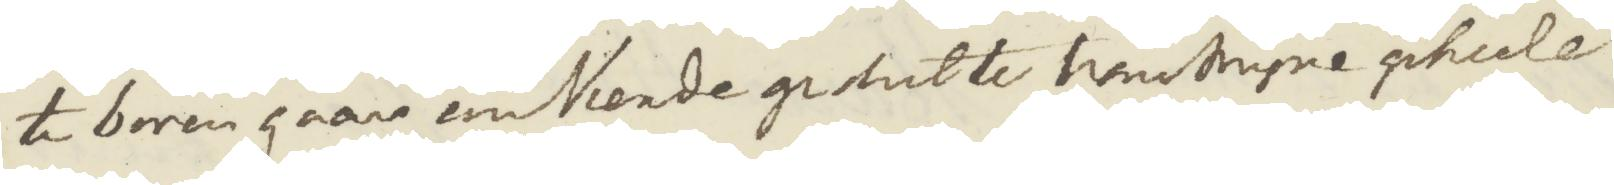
te boven gaan een Vierde gedeelte van myne geheele
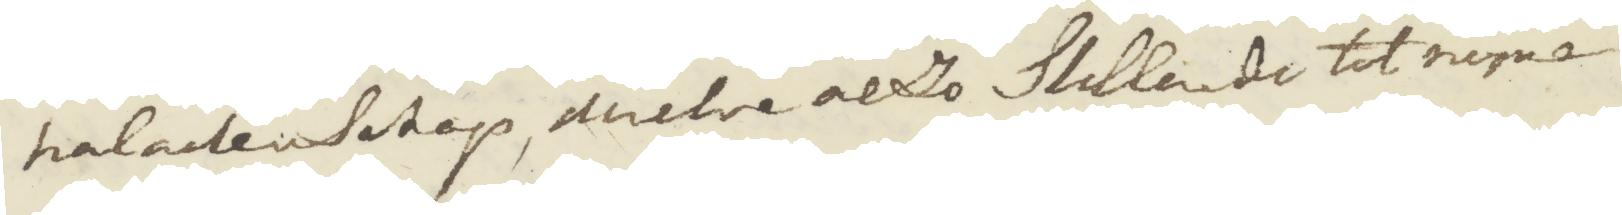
nalaatenschap, deselve alzo stellende tot myne
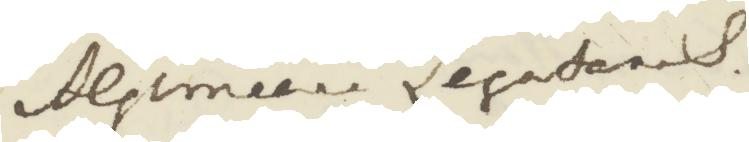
Algemeene Legataris
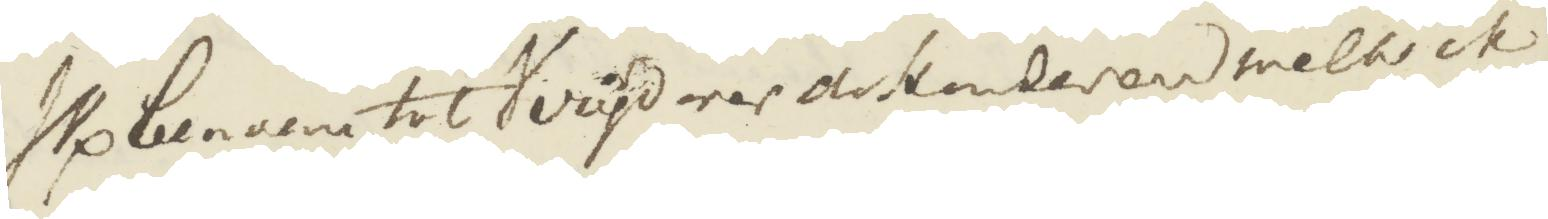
Jk benoem tot Voogd over de kinderen, welke ik
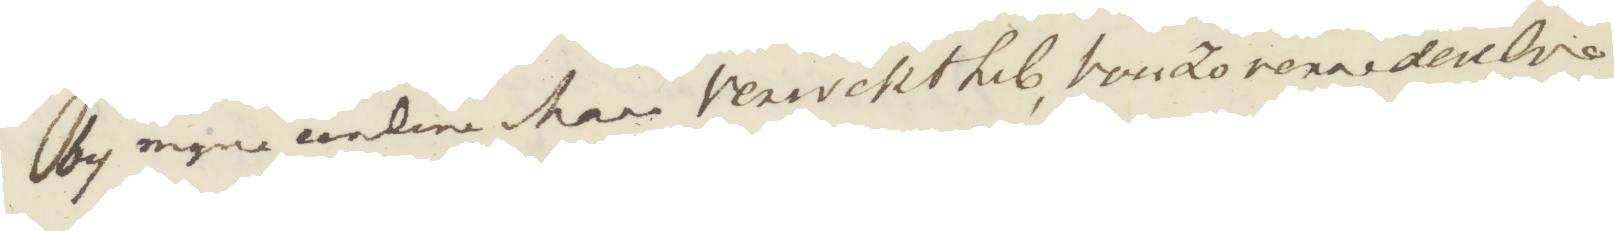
by myne eerdere Man verwekt heb, voor zo verre deselve
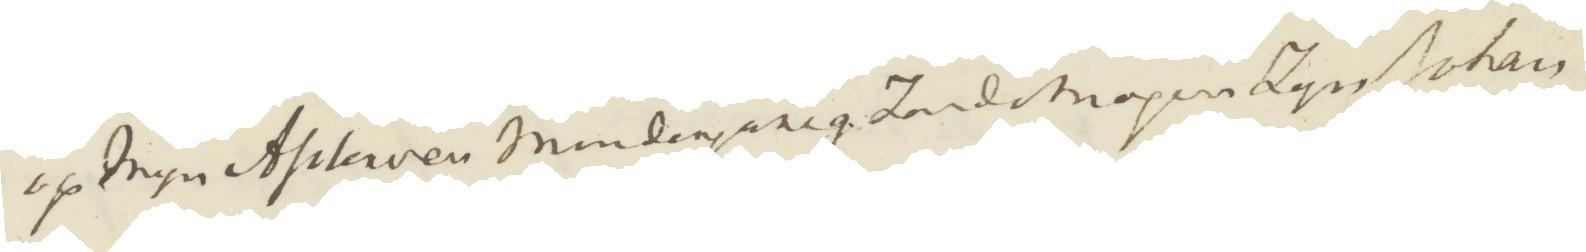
op myn afsterven minderjarig zoude mogen zyn, Johan
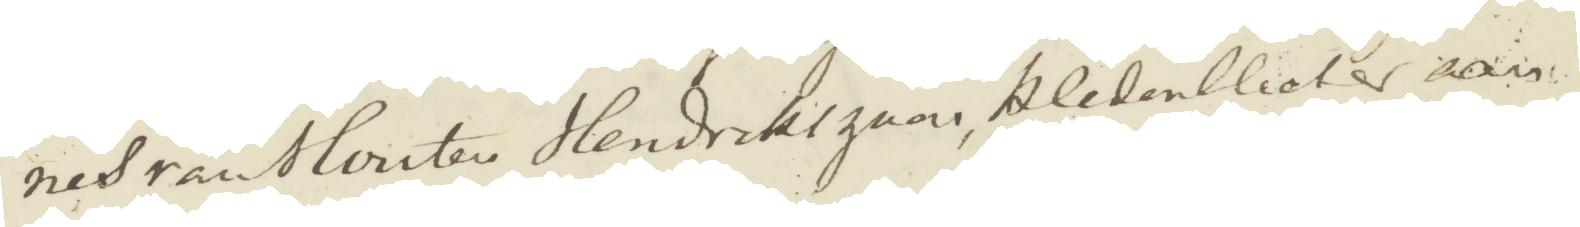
nes van Houten Hendrikszoon, klederbleeker aan
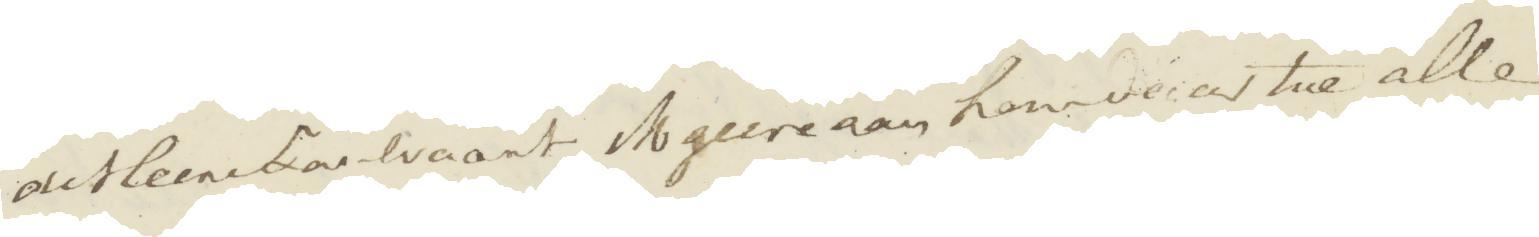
de Heere Zeulvaart, ik geeve aan hem daartoe alle
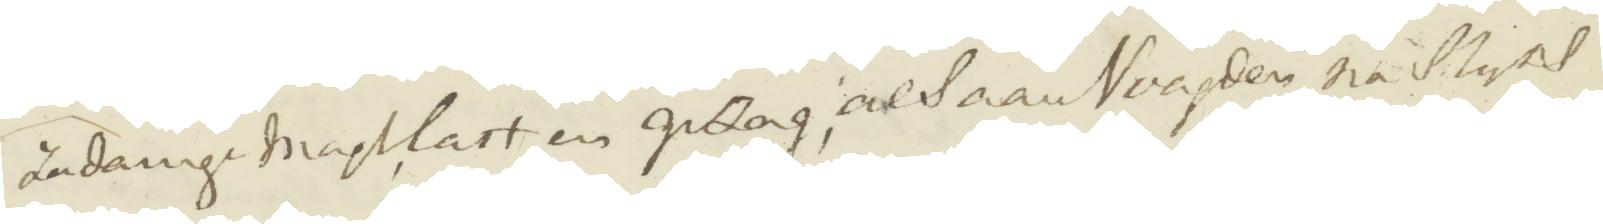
zodanige magt, last, en gezag, als aan Voogden na 'S Ryks
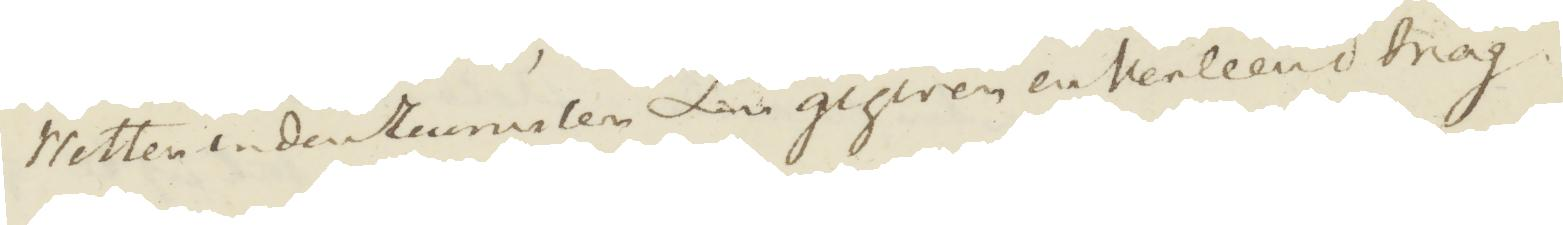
Wetten in den Ruimsten Zin gegeven en verleend mag
